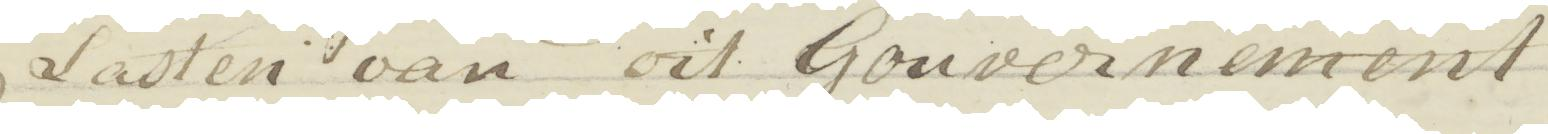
Lasten van dit Gouvernement
